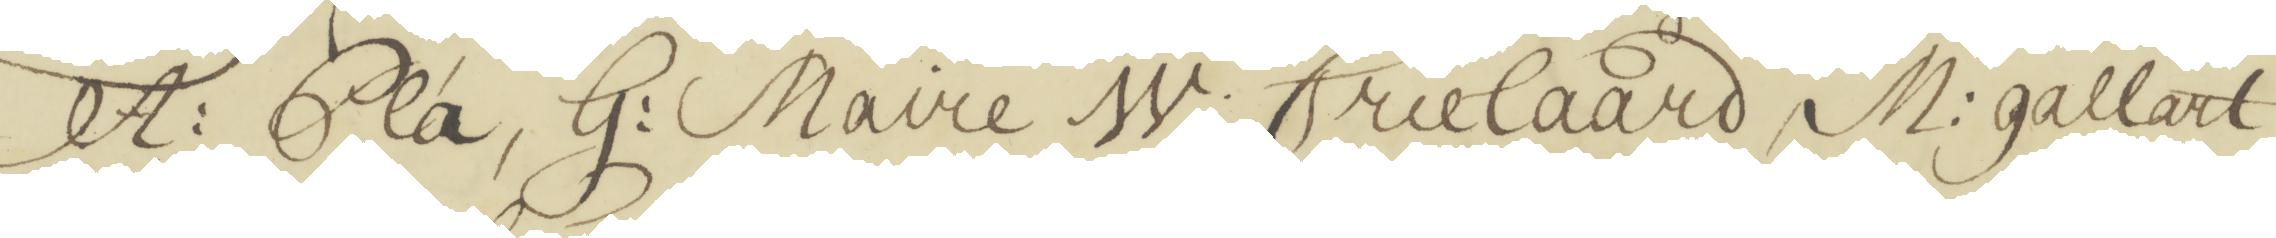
A: Plá, G: Maire W: Crielaard, M: gallart
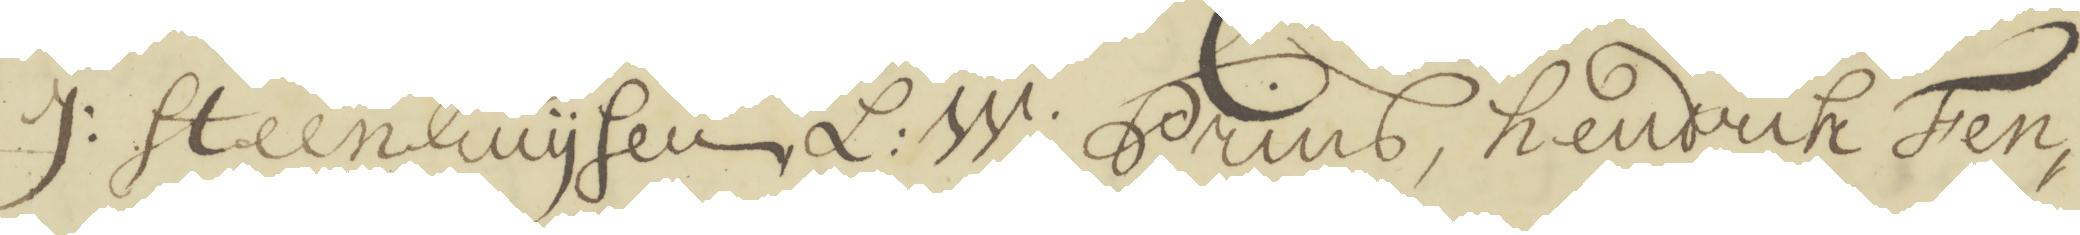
J: steenhuijsen, L: W: Prins, hendrik Ten„
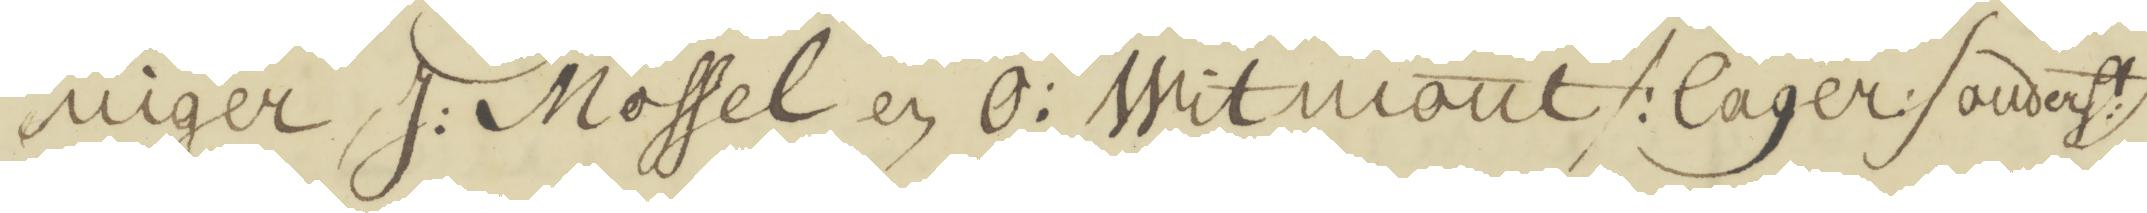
niger, J: Mossel en O: Witmont /:lager:/ onders:t/
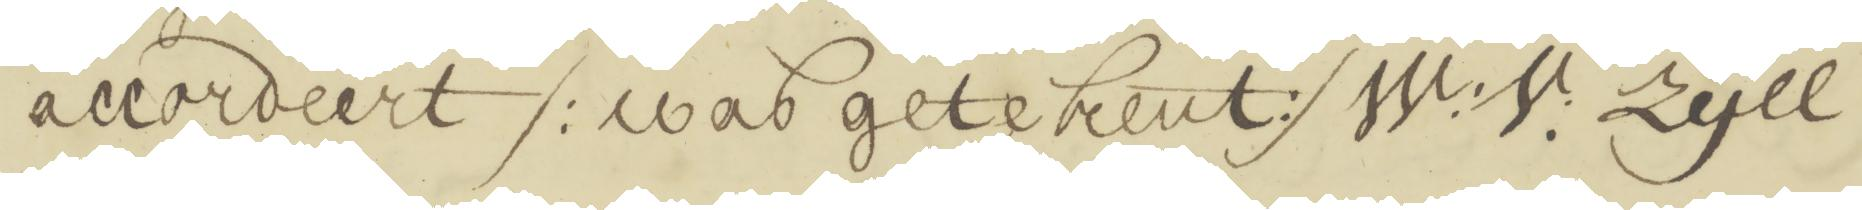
accordeert /:was getekent:/ W:V: Zijll
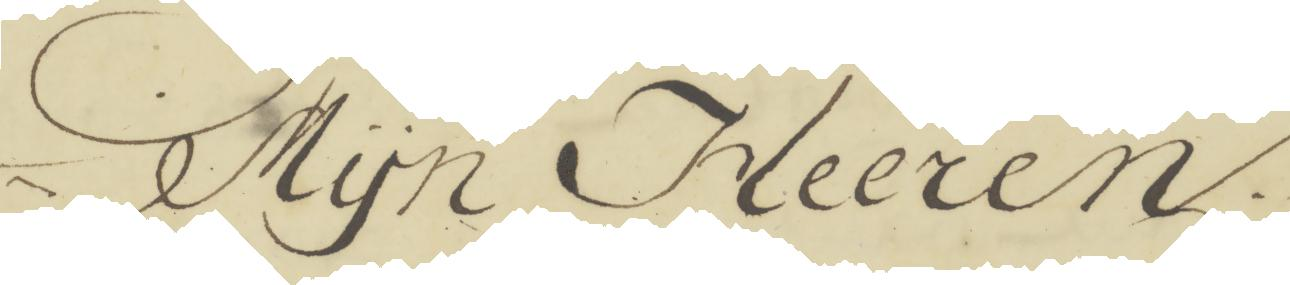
Mijn Heeren.
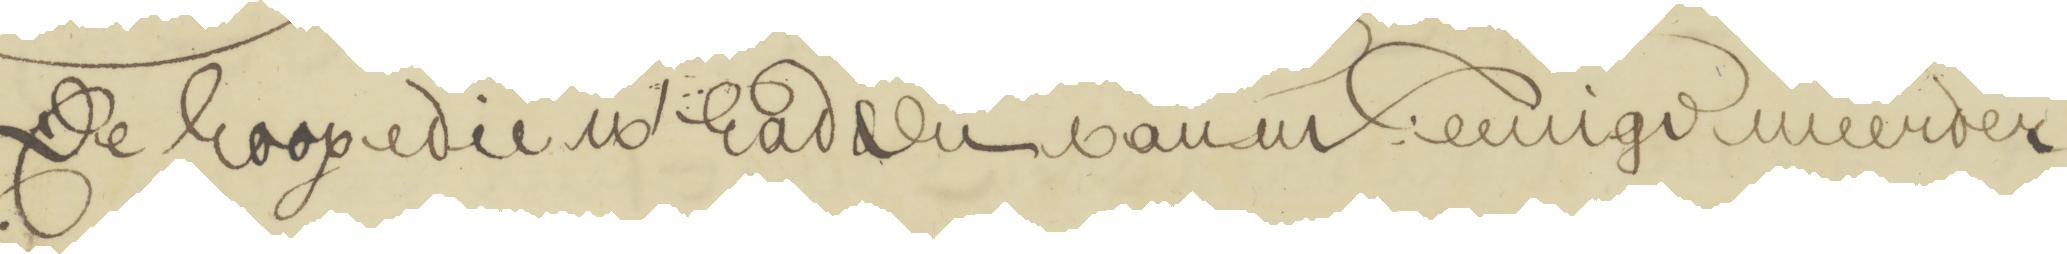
De hoope die w' hadden van uE: eenige meerder
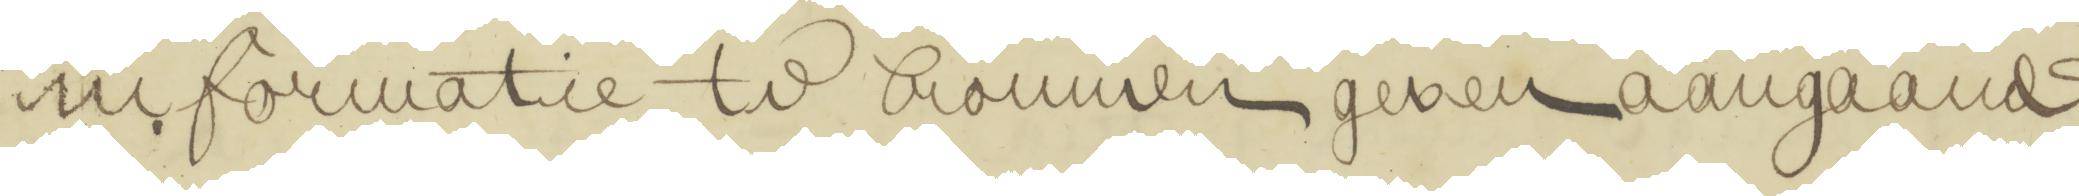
informatie te konnen geven aangaand
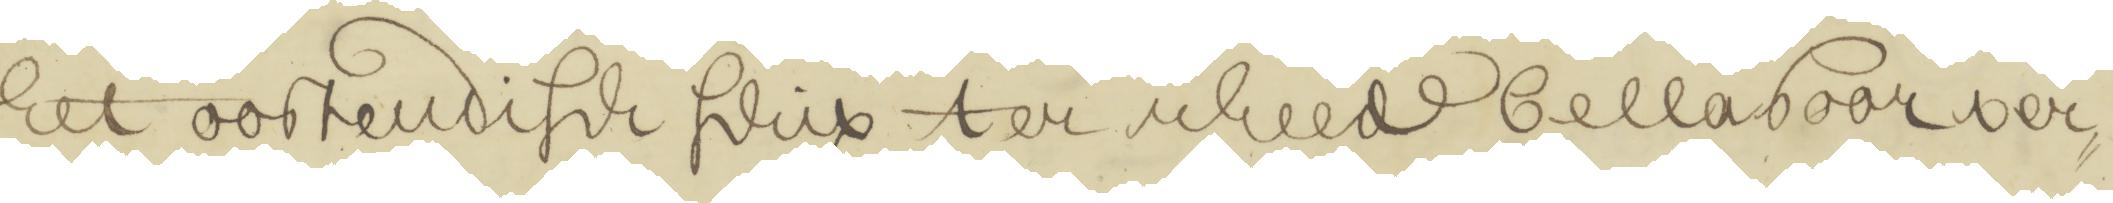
het oostendisch schip ter rheede bellasoor ver„
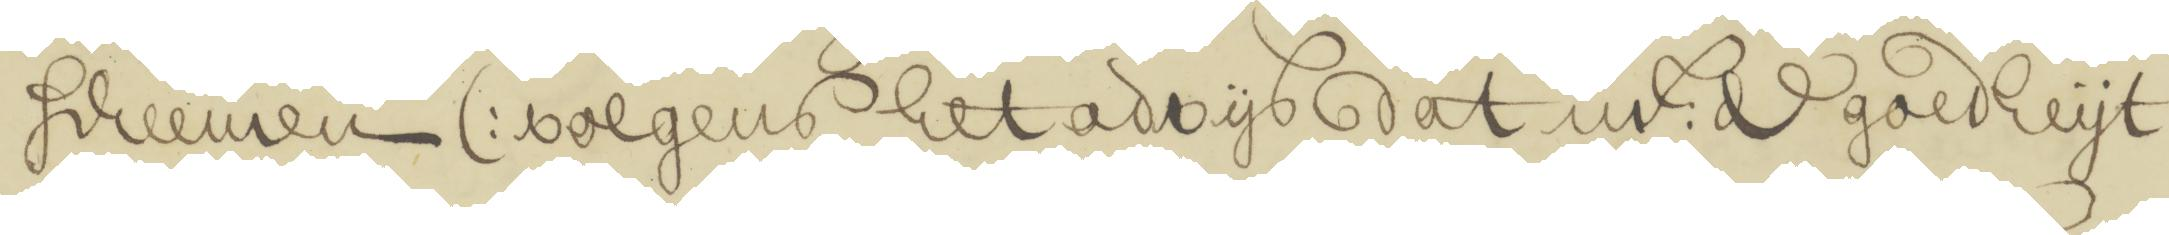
scheenen (:volgens het advijs dat uE: de goedheijt
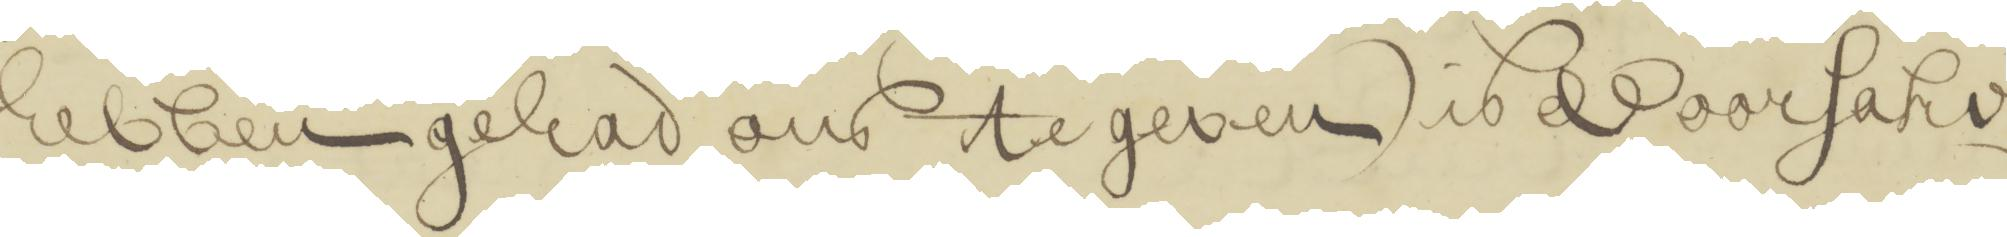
hebben gehad ons te geven) is de oorsake
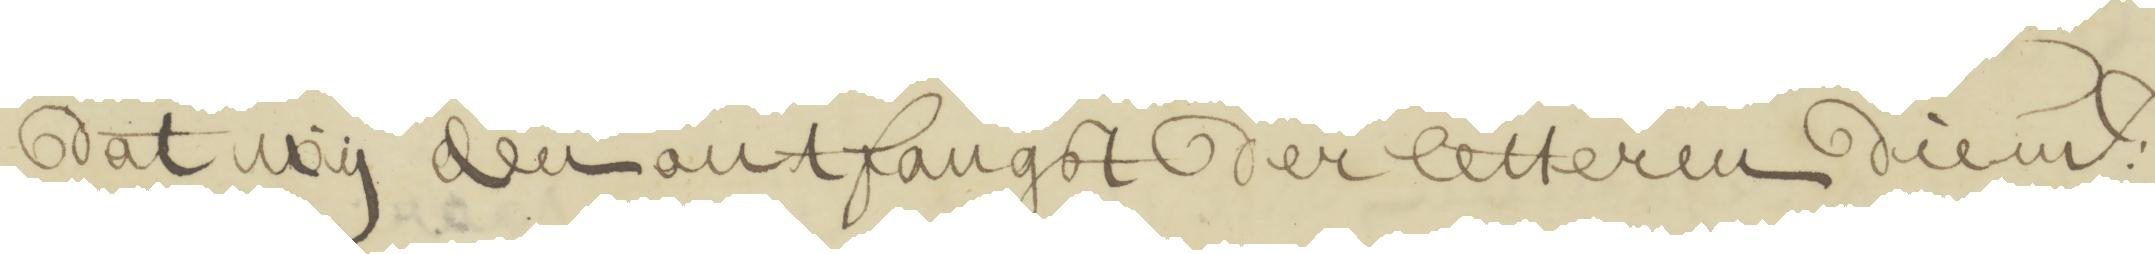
dat wij den ontfangst der letteren die uE:
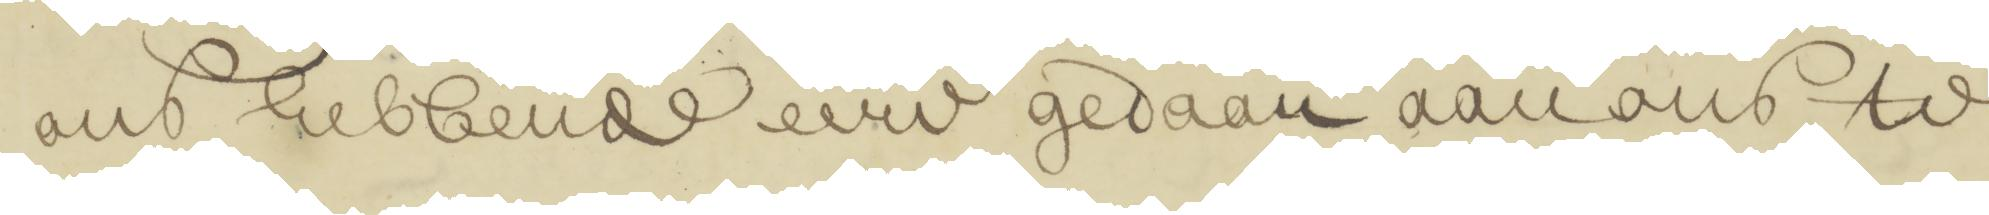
ons hebbende eere gedaan aan ons te
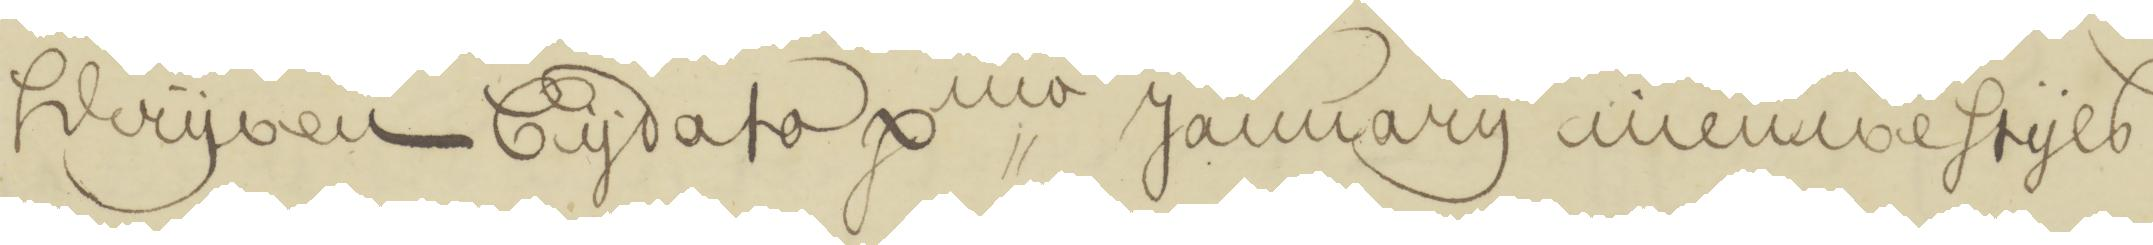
schrijven bij dato p„mo Januarij nieuwe stijls
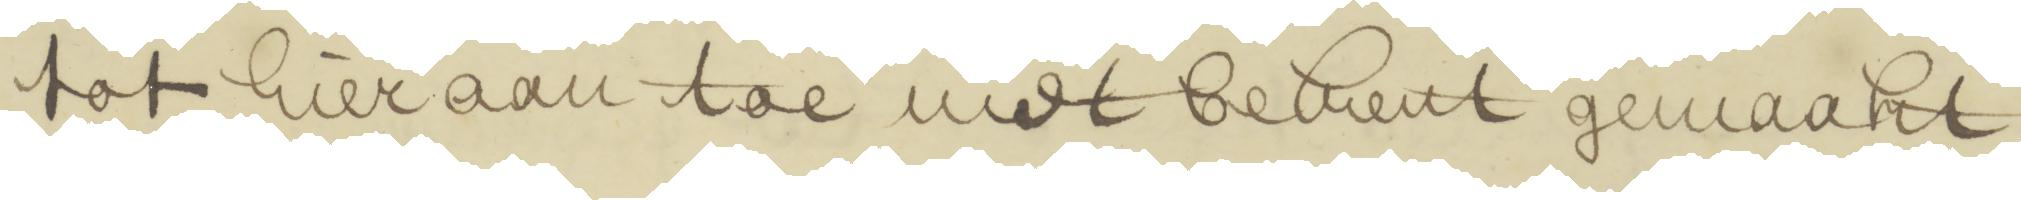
tot hier aan toe niet bekent gemaakt
